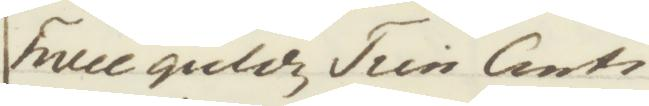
Twee gulden Tien Cents
